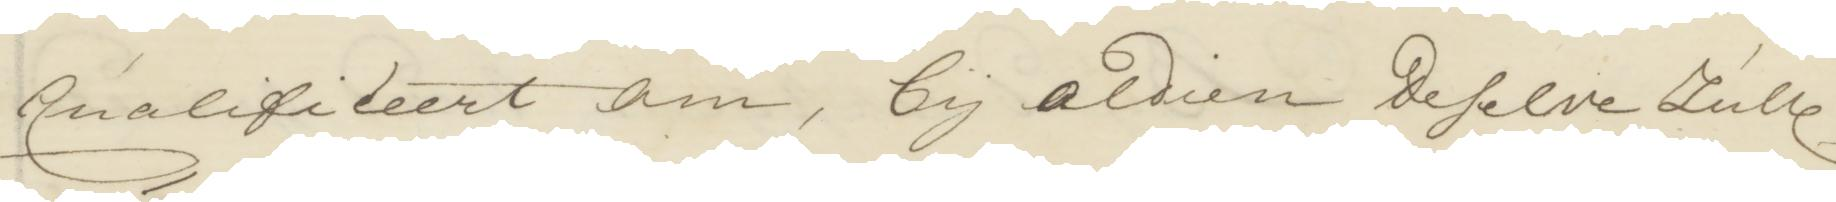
qualificeert om, bij aldien deselve zulx
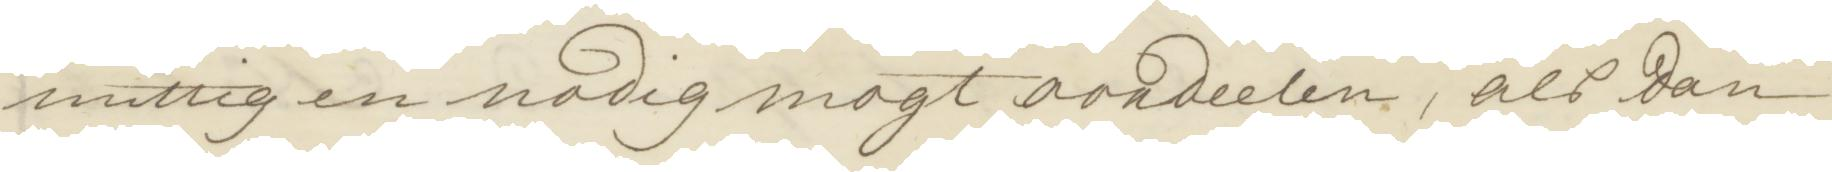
nuttig en nodig mogt oordeelen, als dan
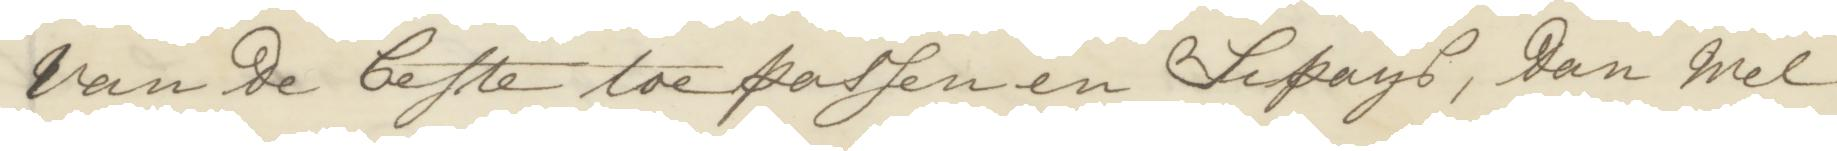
van de beste toepassen en Sipaijs, dan wel
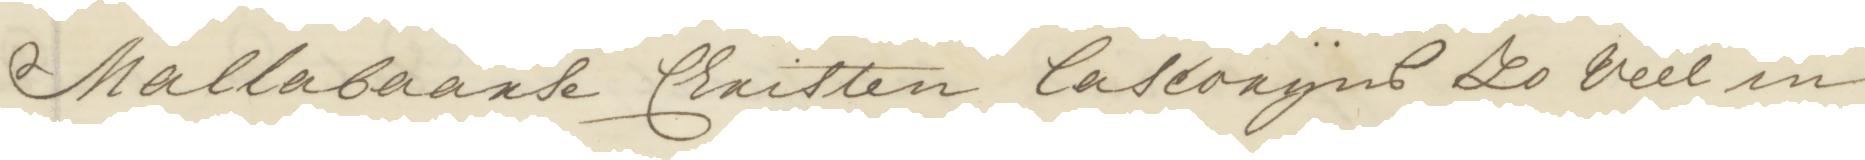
Mallabaarse Christen lascorijns zo veel in
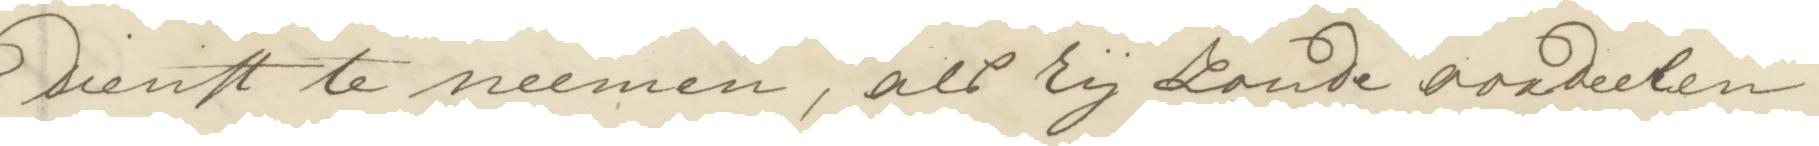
dienst te neemen, als hij zonde oordeelen
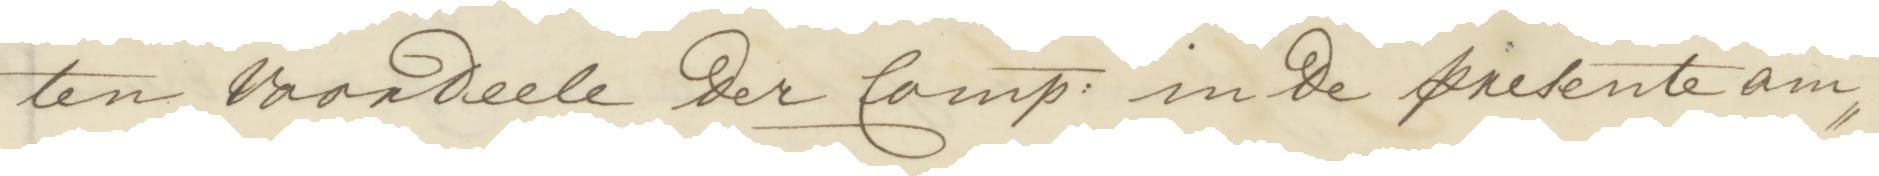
ten voordeele der Comp: in de presente om„
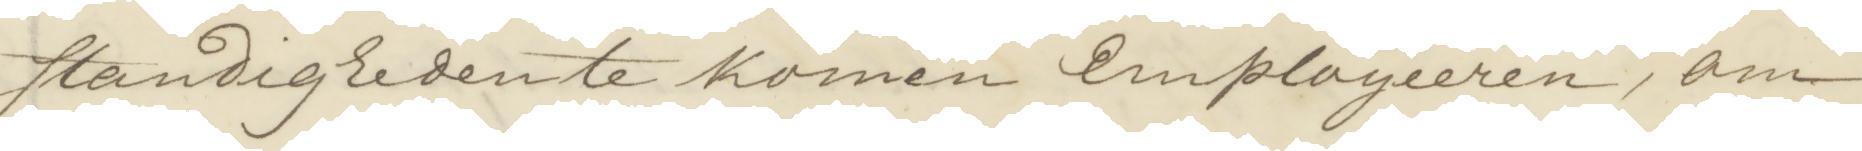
standigheden te komen Emploijeeren, om
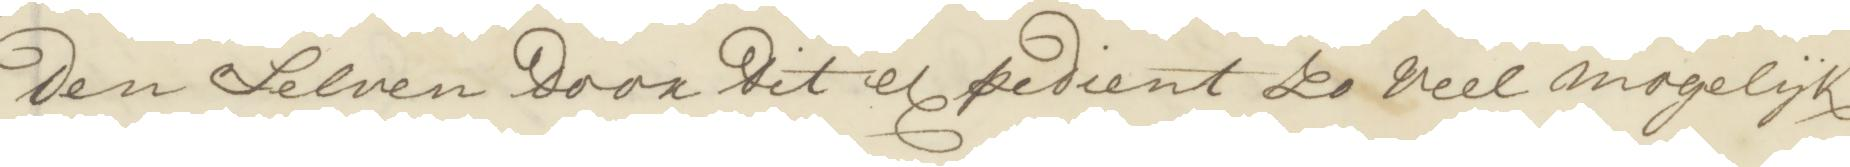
den selven door dit expedient zo veel mogelijk
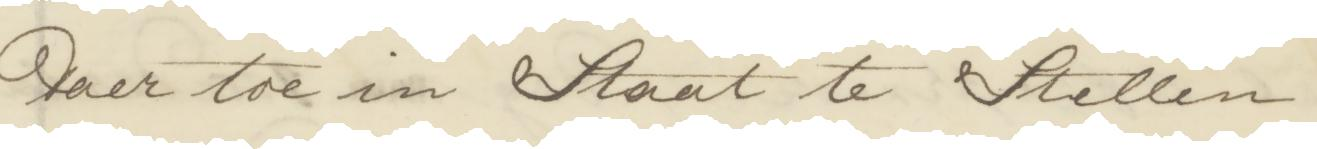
daer toe in staat te stellen
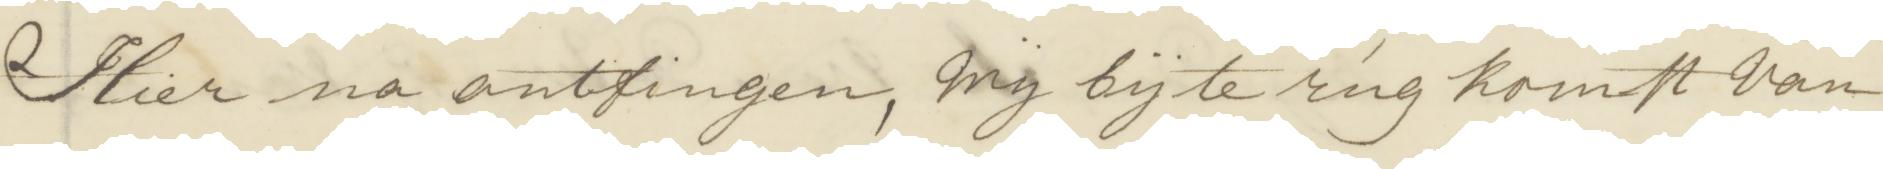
Hier na ontfingen, wij bij te rug komst van
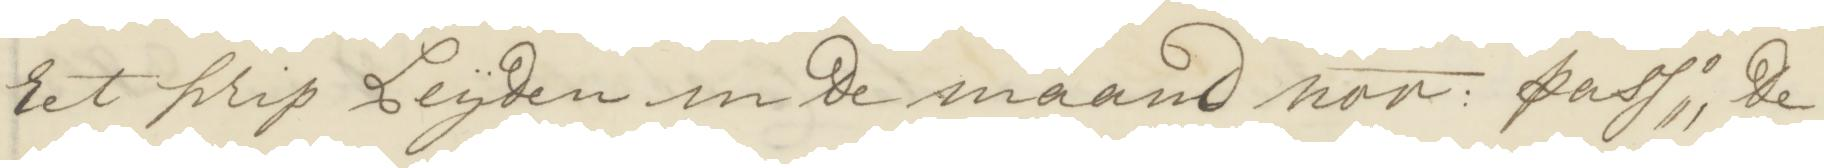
het schip Leijden in de maand nov: pass„o, de
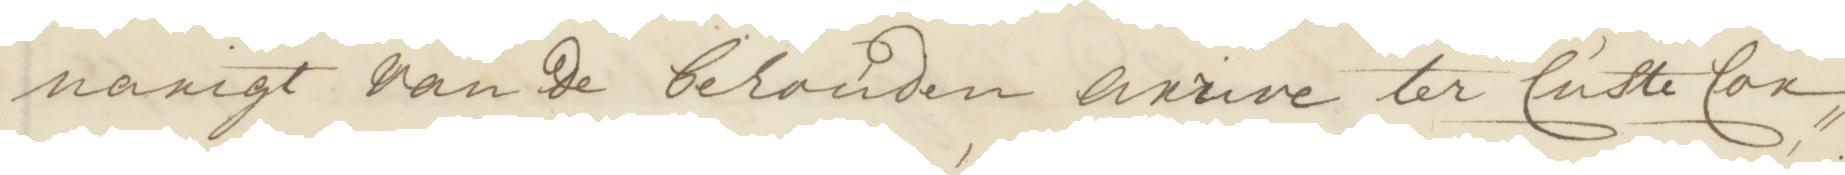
narigt van de behouden arrive ter Custe Cor„
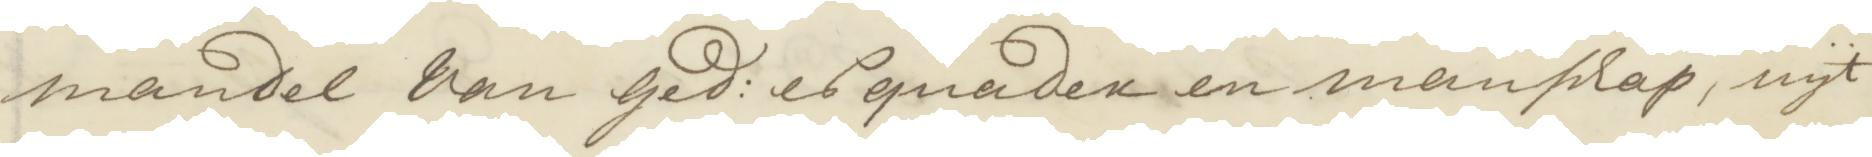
mandel van ged: esquader en manschap, uijt
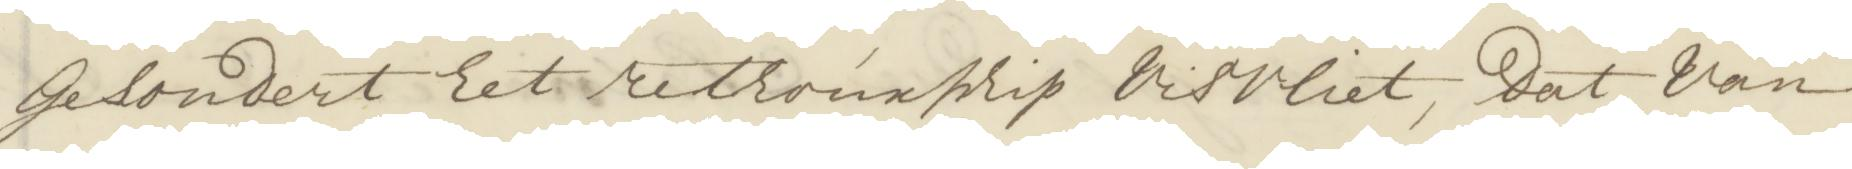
gesondert het rethourschip visvliet, dat van
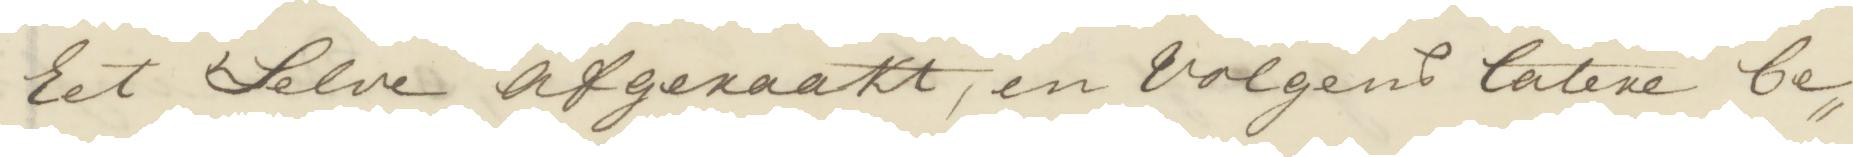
het selve afgeraakt ,en volgens latere be„
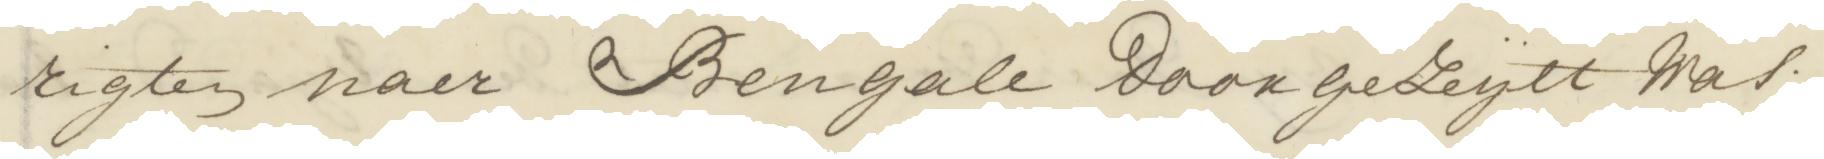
rigten naer Bengale doorgezeijlt was;
